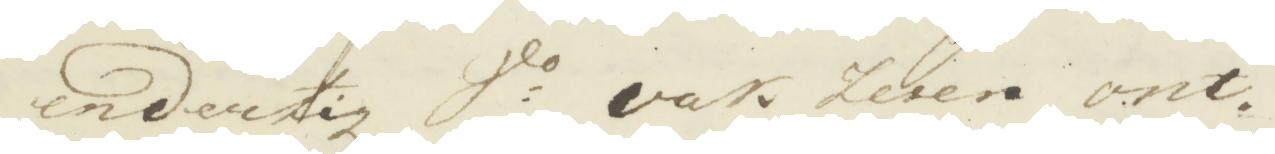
en dertig V:o vak Zeven ont„
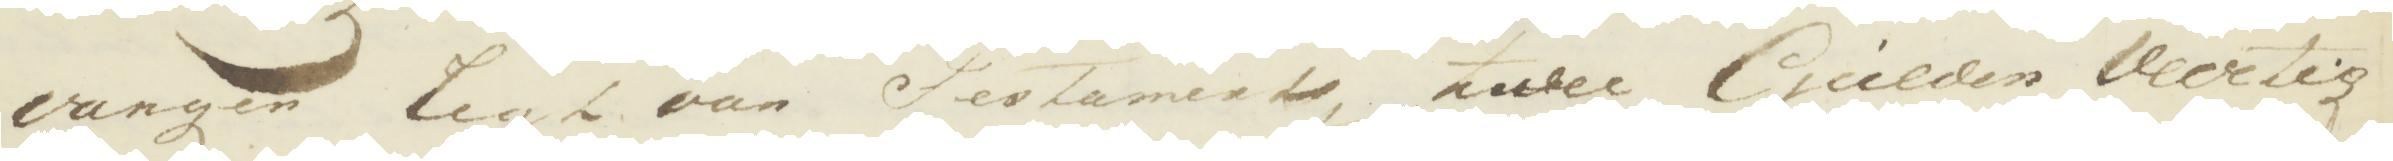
vangen regt van Testamert, twee Gulden Veertig
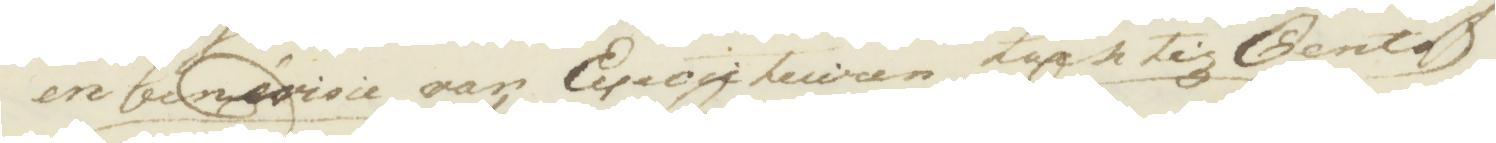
en benevisie van Executie van tachtig Cents
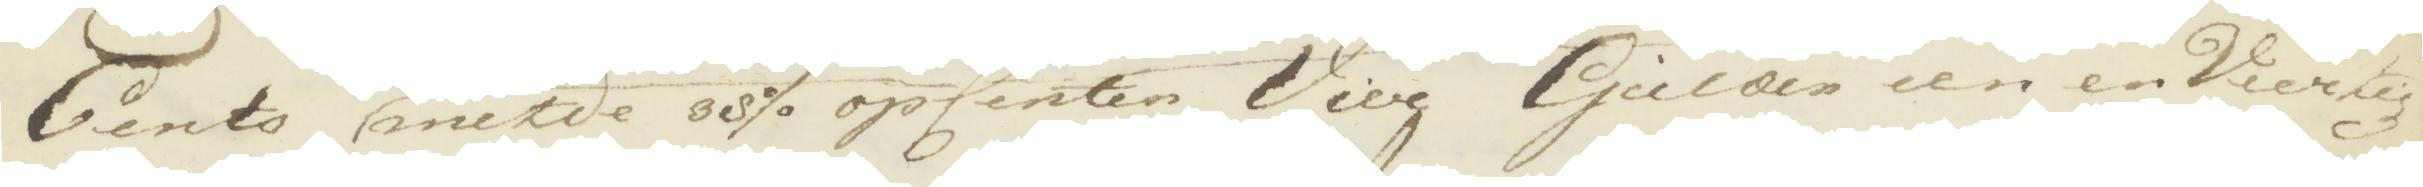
Cents met de 38%. op Centen Vier Gulden een en Veertig
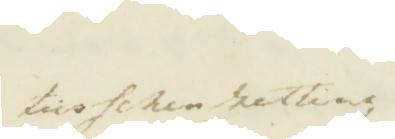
tusschen zetting
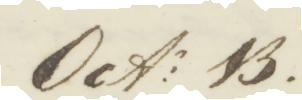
Oct: 13.
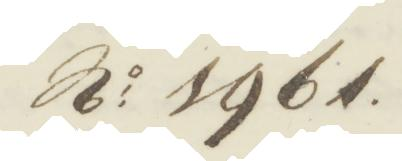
N:o 1961.
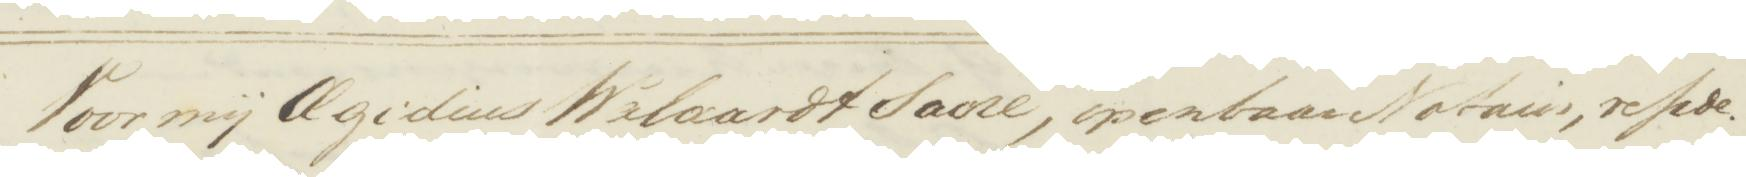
Voor mij Aegidius Walaardt Sacré, openbaar Notaris, reside.
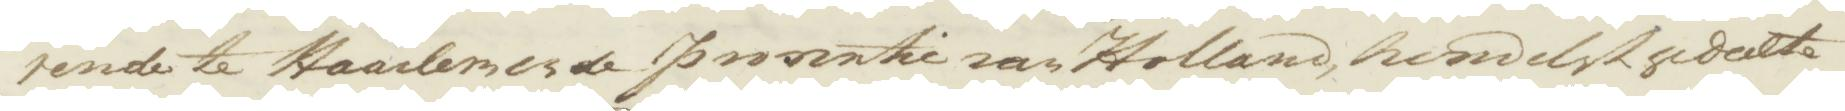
rende te Haarlem in de provintie van Holland, noordelyk gedeelte
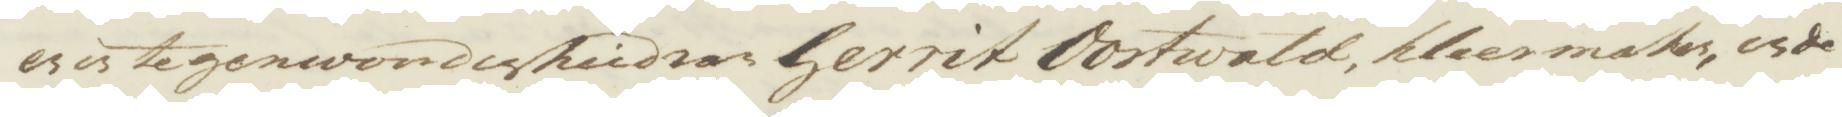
en in tegenwoordigheid van Gerrit Oostwald, kleermaker, in de
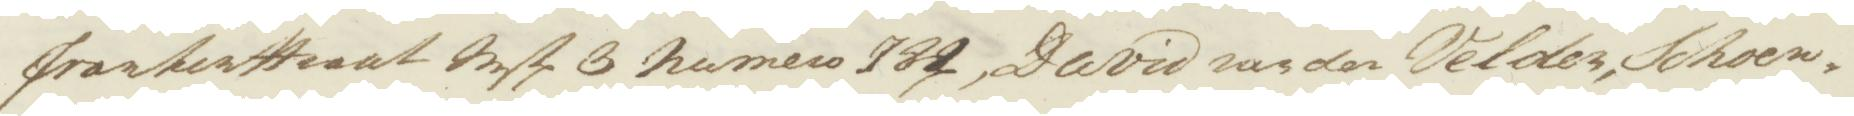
frankenstraat wyk 3 numero 782, David van der Velden, Schoen„
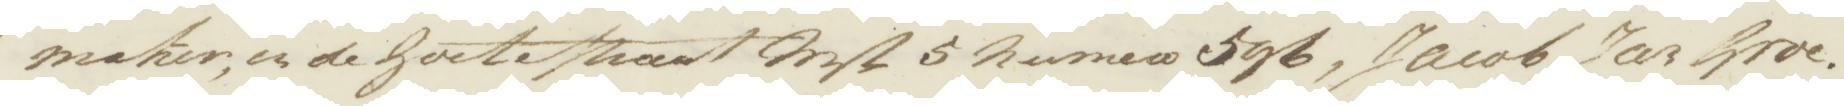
maker, in de Zoetestraat wyk 5 numero 596, Jacob Jan Groe„
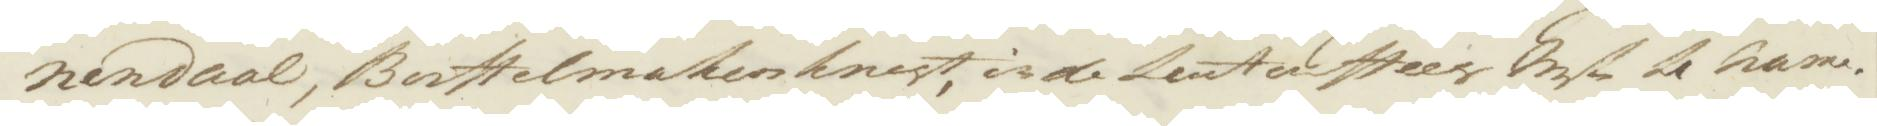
nendaal, Borstelmakersknegt in de Luitensteeg Wyk 4 nume.
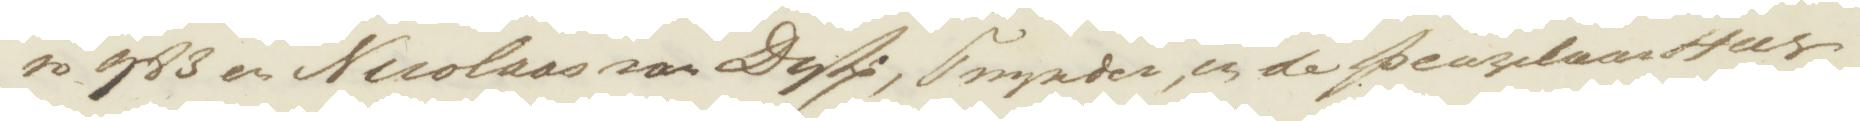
ro 783 en Nicolaas van Dyk, Tuynder, in de peuzelaarsteeg.
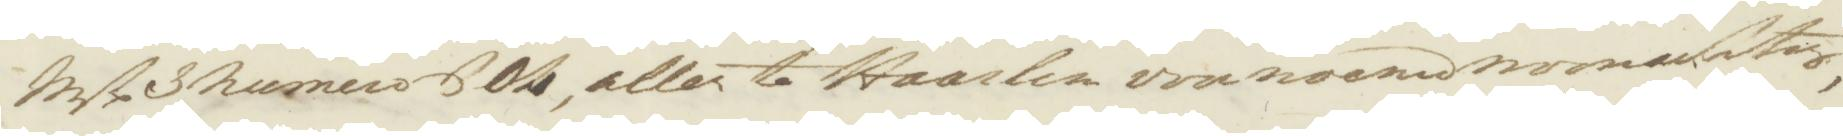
Wyk 3 numero 604, allen te Haarlem voornoemd woonachtig,
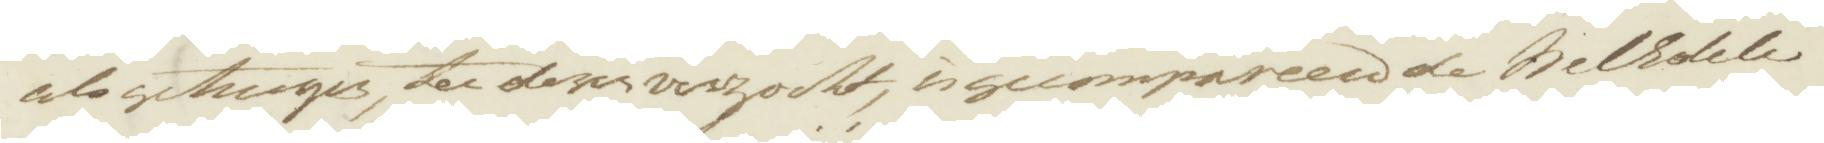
als getuigen, ten dezen verzocht, is gecompareerd de WelEdele
